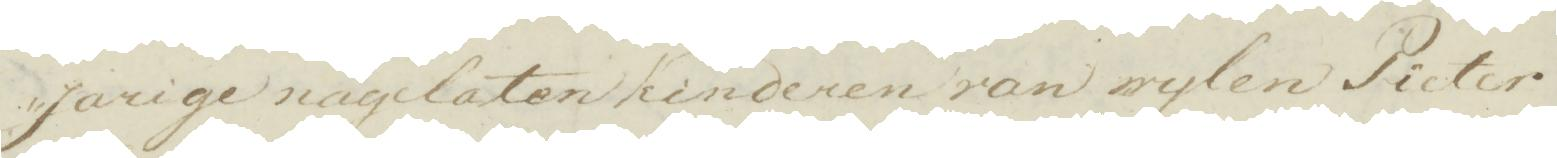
„jarige nagelaten kinderen van wylen Pieter
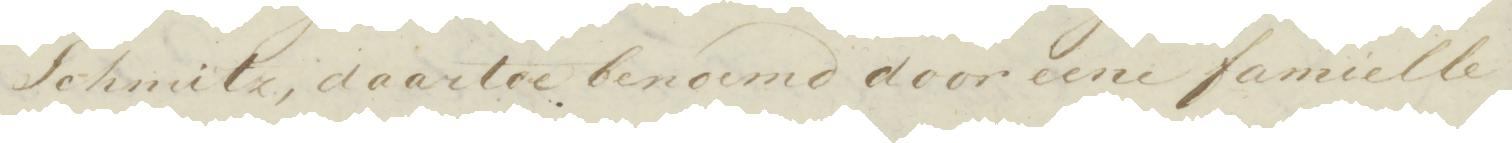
Schmitz, daartoe benoemd door eene famielle
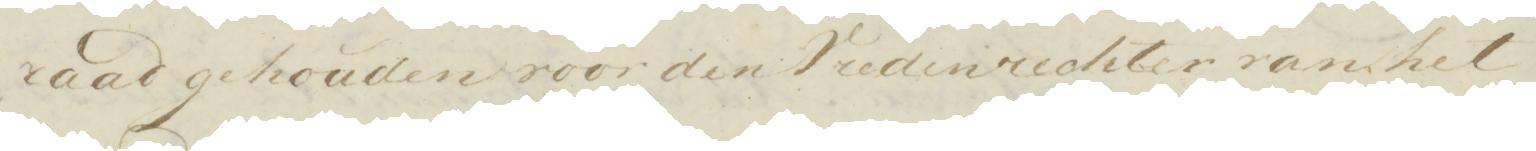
raad gehouden voor den Vredenrechter van het
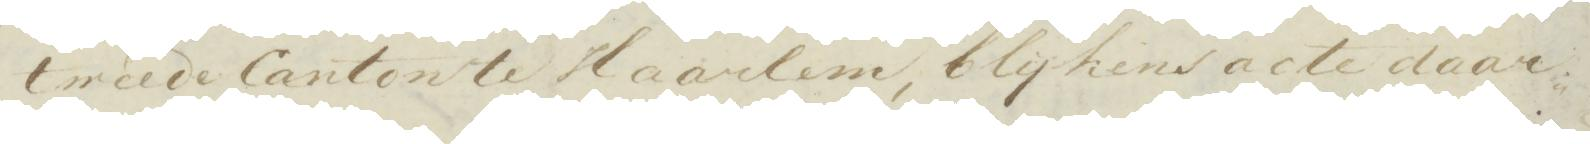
tweede Canton te Haarlem, blijkens acte daar„
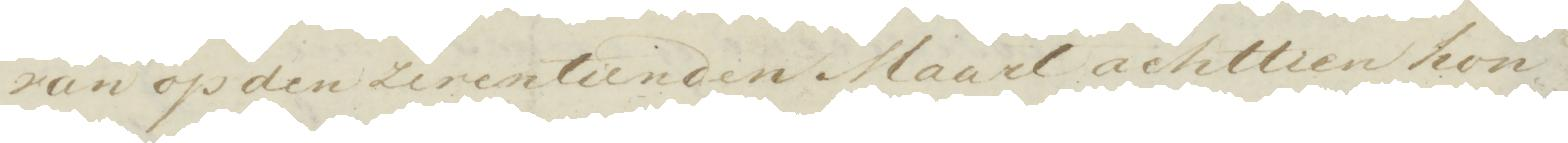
van op den zeventienden Maart achttien hon
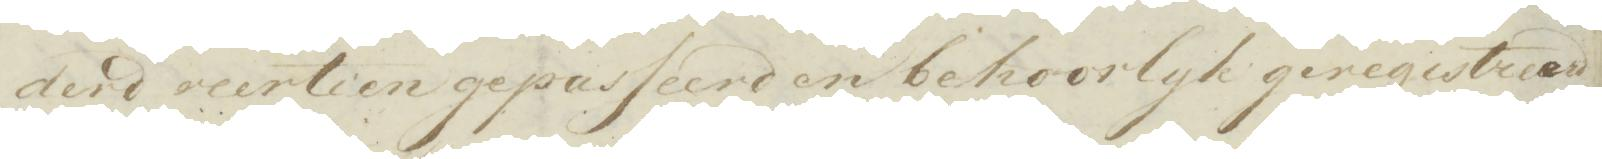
derd veertien gepasseerd en behoorlijk geregistreerd
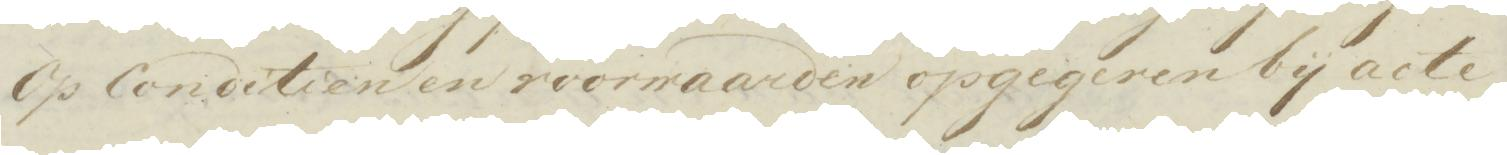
Op conditien en voorwaarden opgegeven bij acte
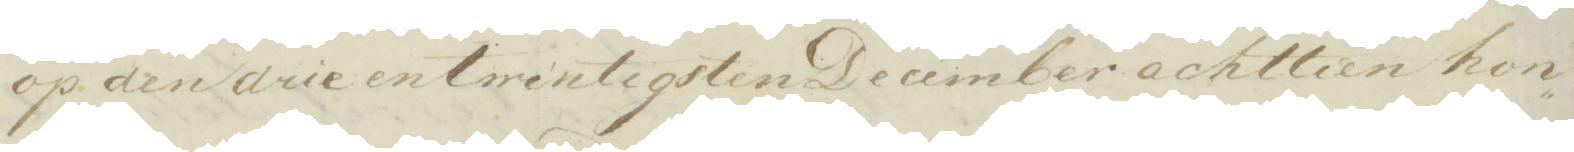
op den drie en twintigsten December achttien hon„
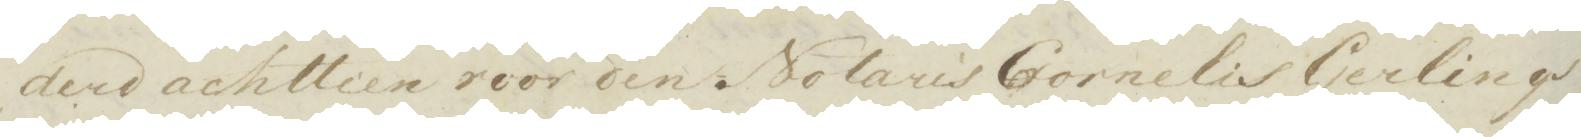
derd achttien voor den Notaris Cornelis Gerlings
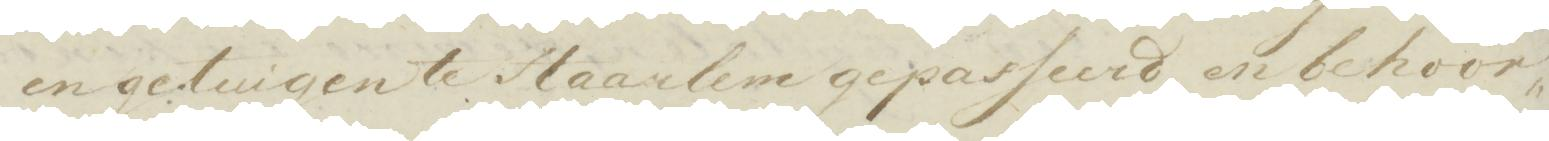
en getuigen te Haarlem gepasseerd en behoor„
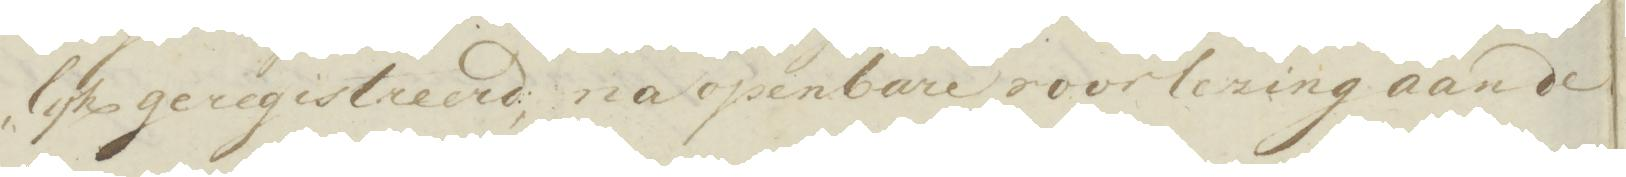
lijk geregistreerd, na openbare voorlezing aan de
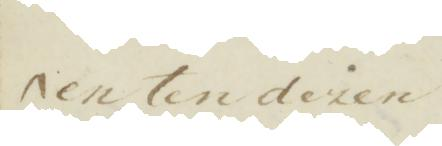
^en ten dezen
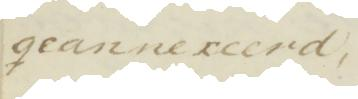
geannexeerd,
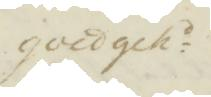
goedgek=d
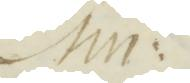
Am:
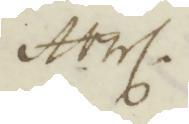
Atnc.
